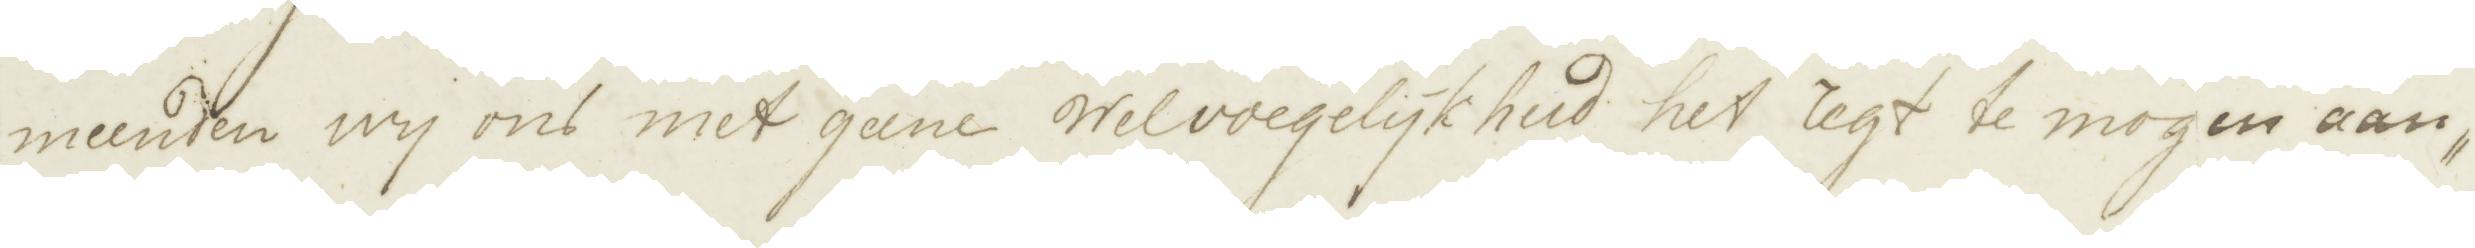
meenden wij ons met geene wel voegelijkheid het regt te mogen aan„
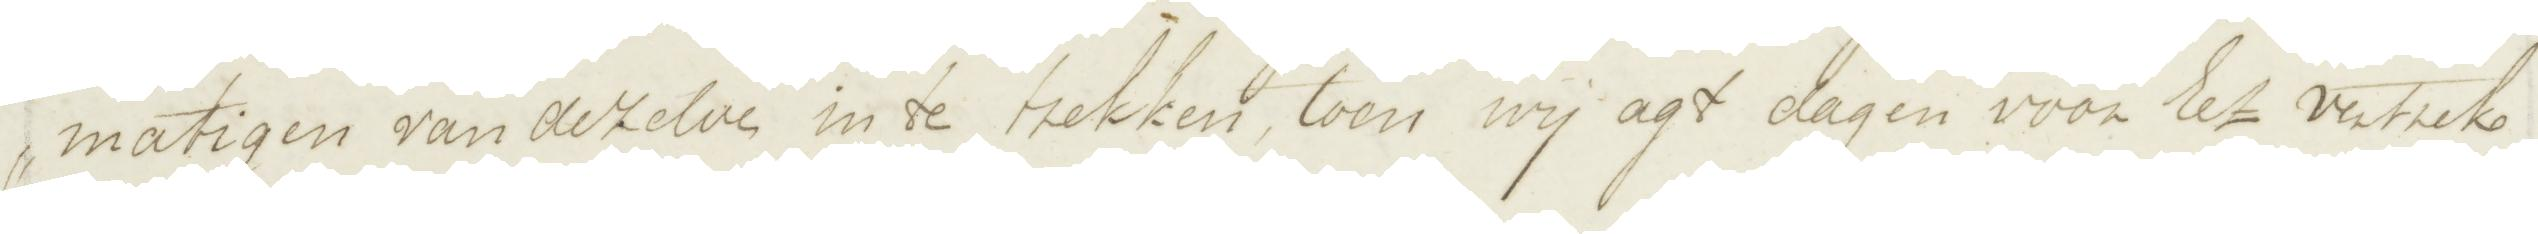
„matigen van dezelve in te trekken, toen wij agt dagen voor het vertrek
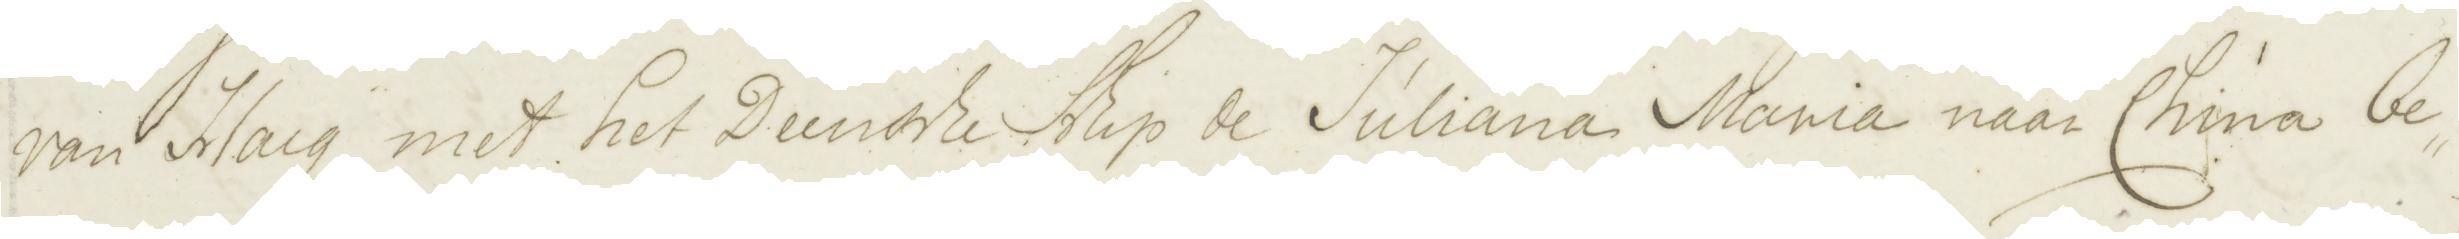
van Haig met het Deensche schip de Juliana Maria naar China be„
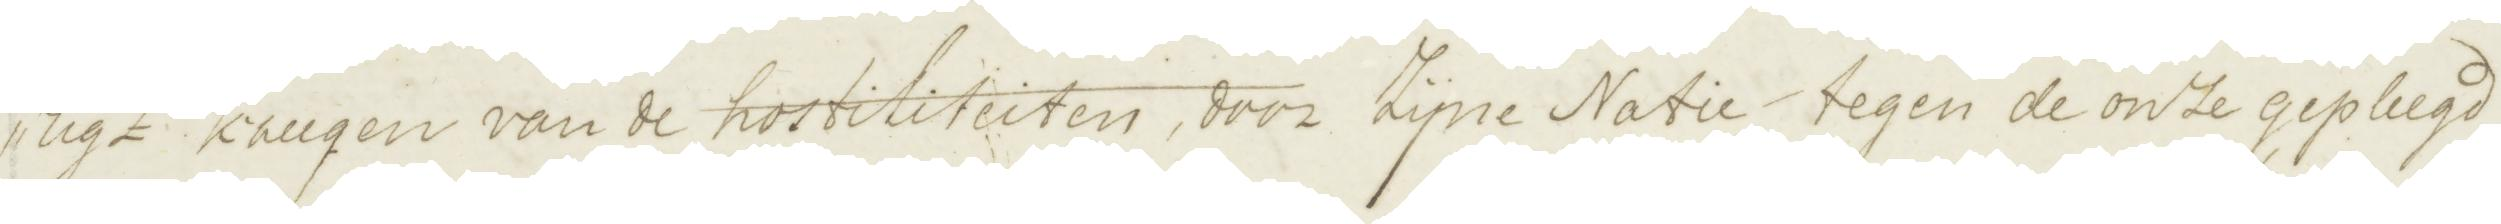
rigt kreegen van de hostiliteiten, door Zijne Natie tegen de onze gepleegd,
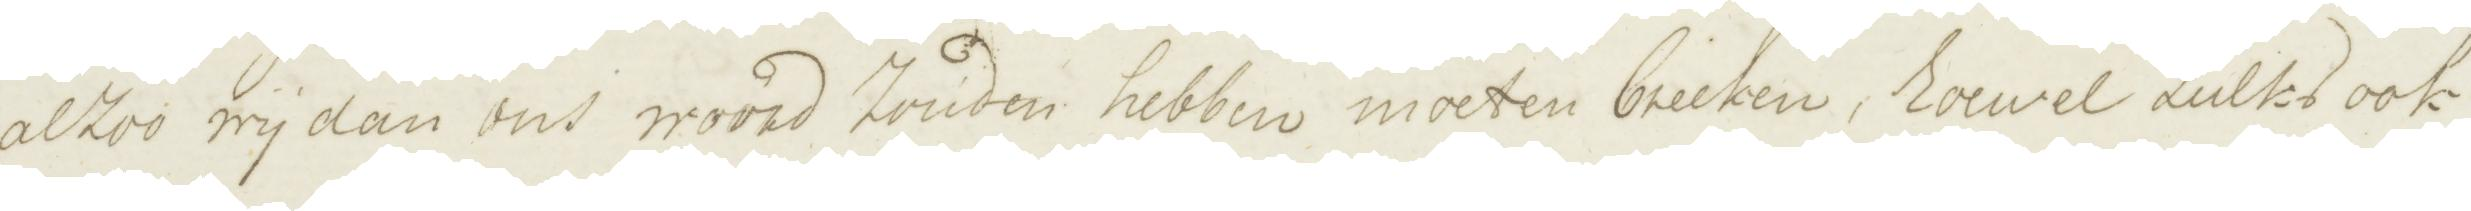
alzoo wij dan ons woord Zouden hebben moeten breeken, hoewel zulks ook
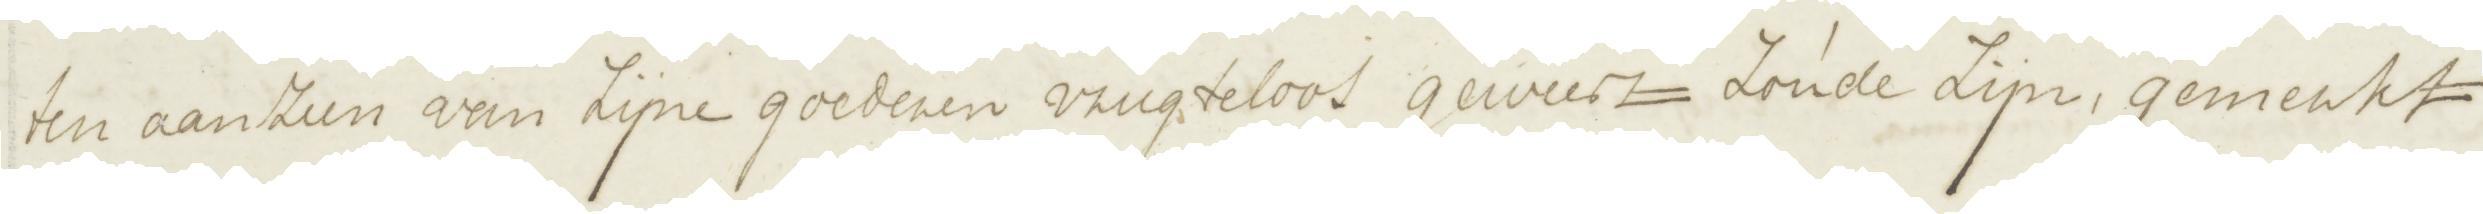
ten aanzien van Zijne goederen vrugteloos geweest Zoude Zijn, gemerkt
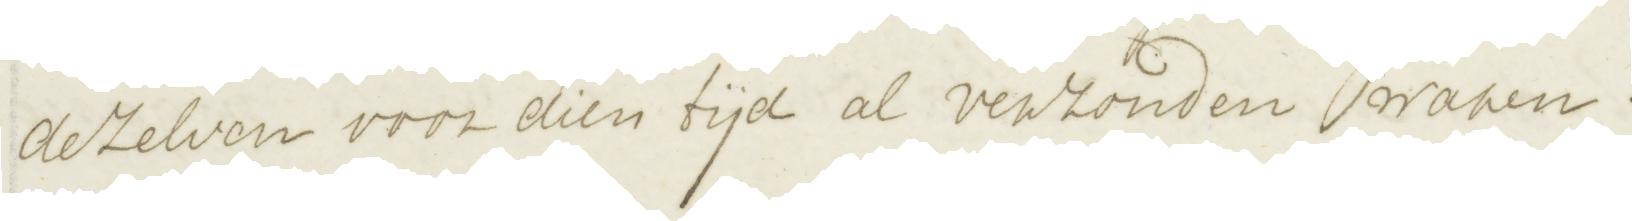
dezelven voor dien tijd al verzonden waren.
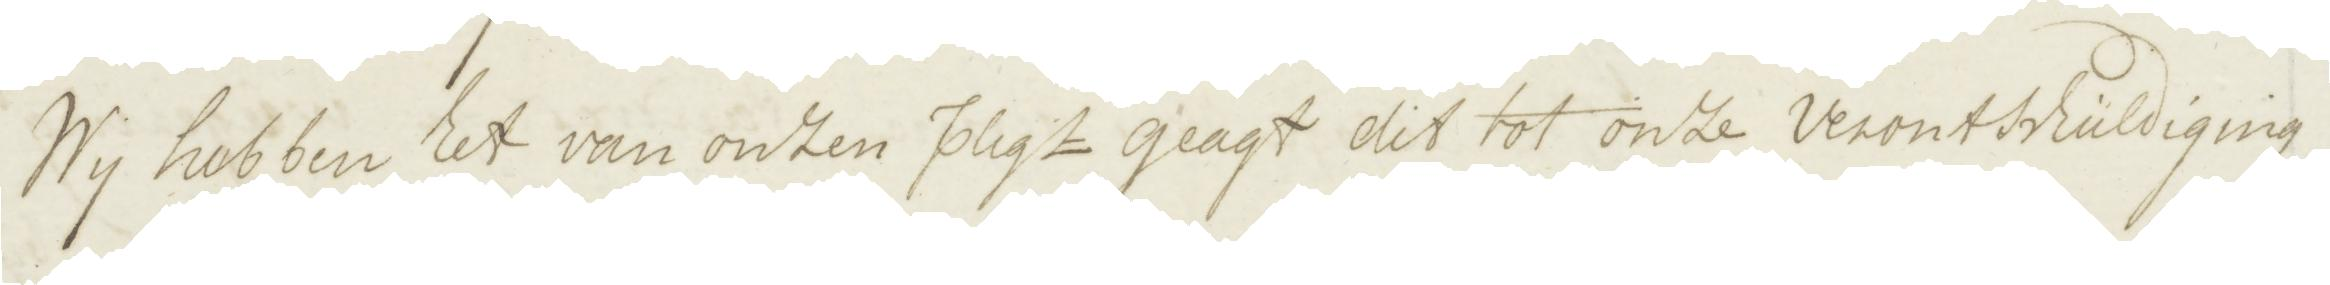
Wij hebben het van onzen pligt geagt dit tot onze verontschuldiging
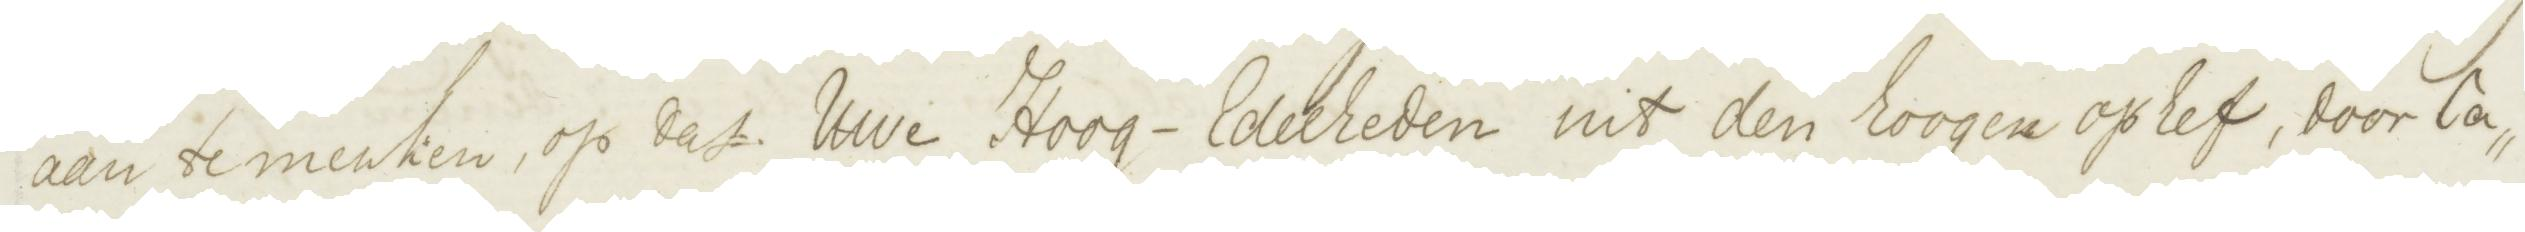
aan te merken, op dat Uwe Hoog-Edelheden uit den hoogen ophef, door Ca„
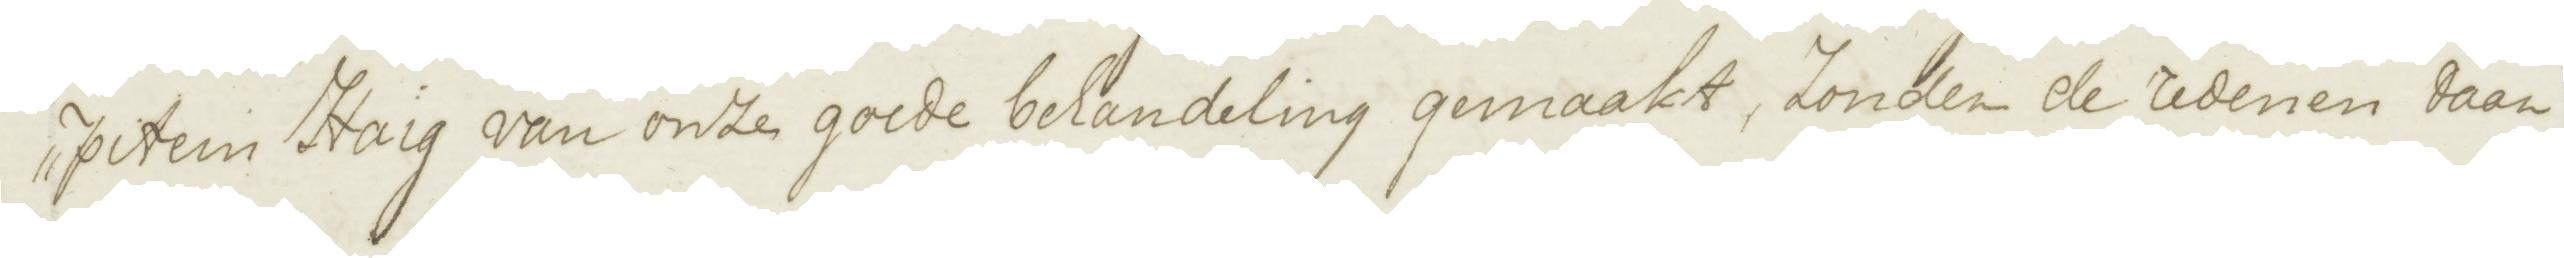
„pitein Haig van onze goede behandeling gemaakt, Zonder de redenen daar
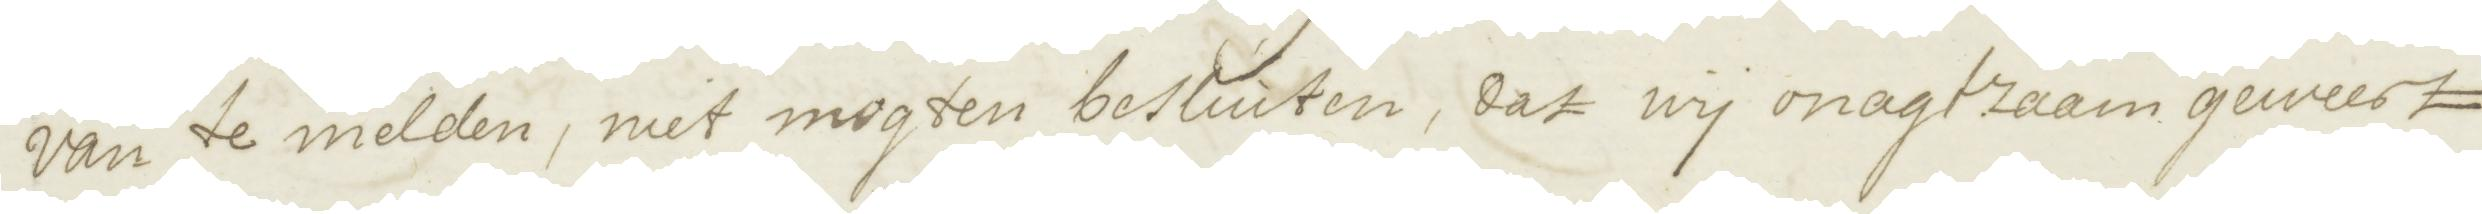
van te melden, niet mogten besluiten, dat wij onagtzaam geweest
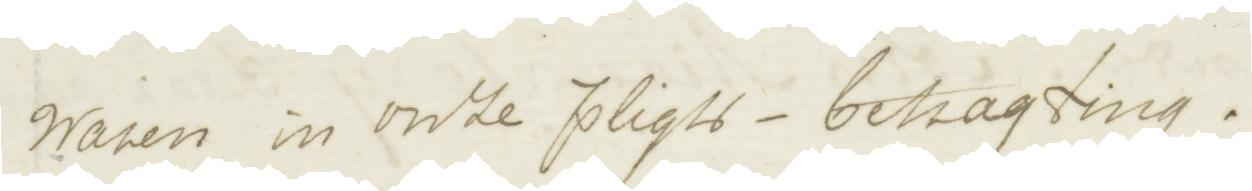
waren in onze pligts-betragting.
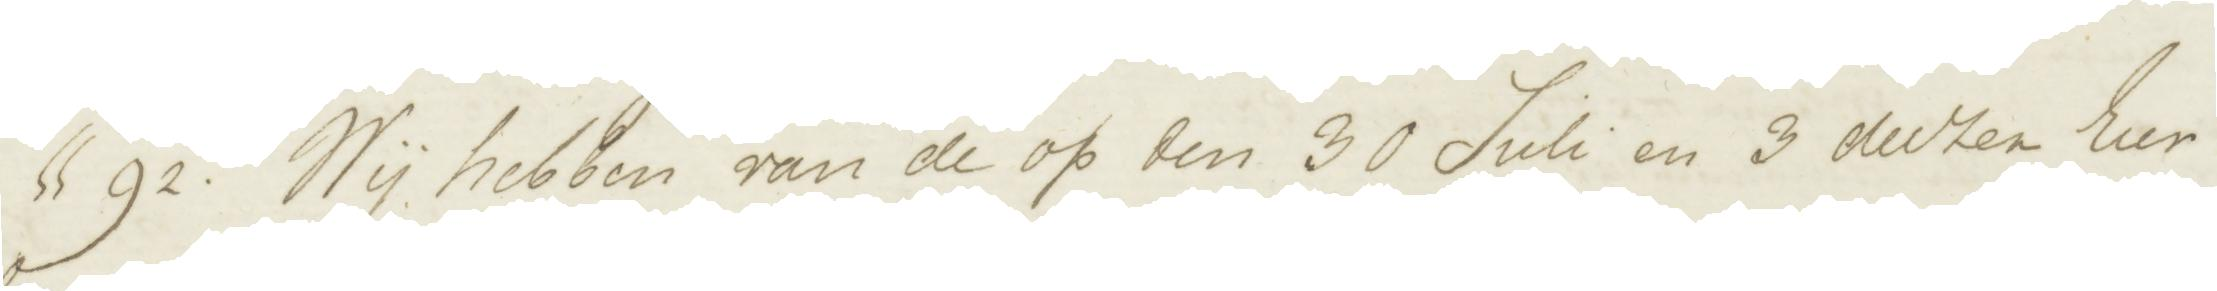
SS 92. Wij hebben van de op den 30 Iuli en 3 deezer hier
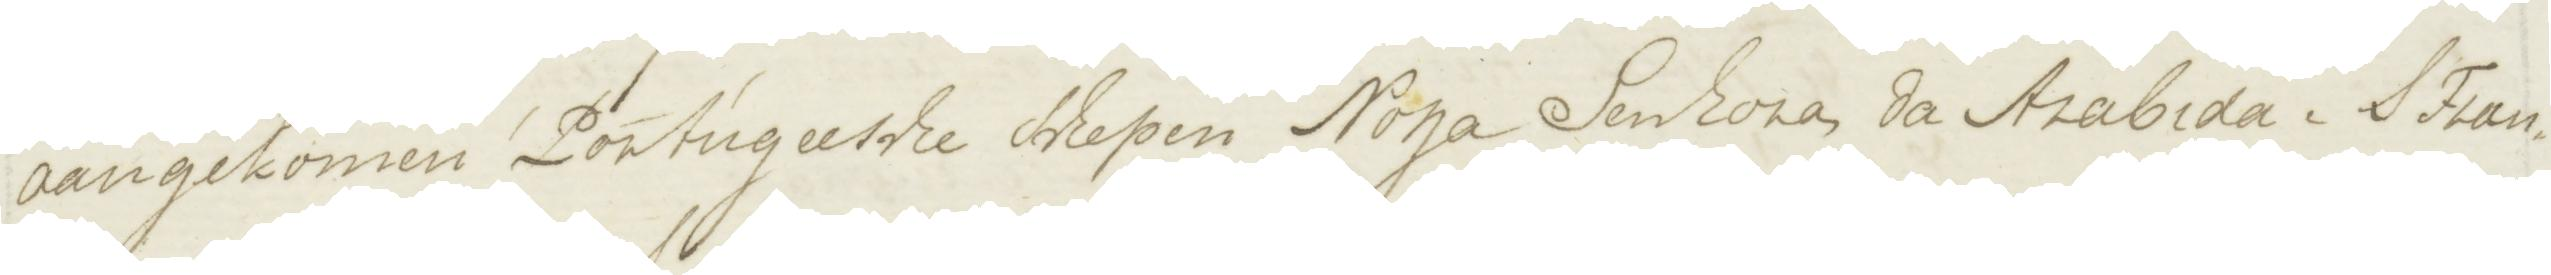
aangekomen Portugeesche schepen Noya Senhoza da Arabida , S Fran
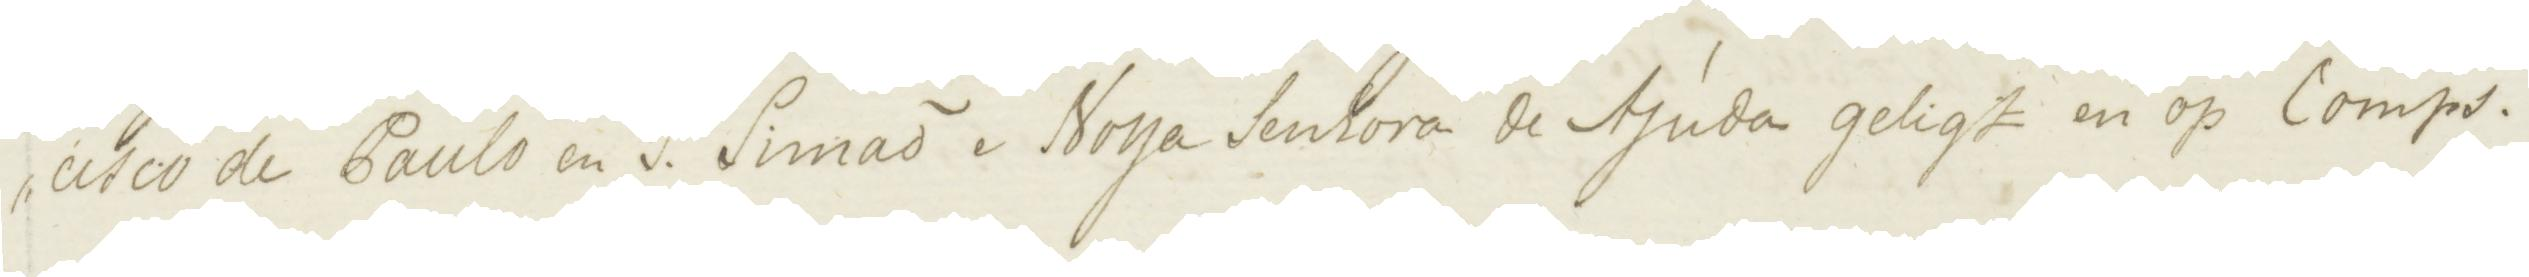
„cisco de Paulo en S. Simas~ e Noya Senhora de Ajuda geligt en op Comps.
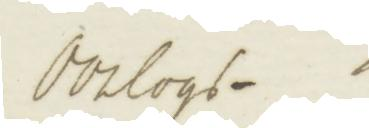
oorlogs-
